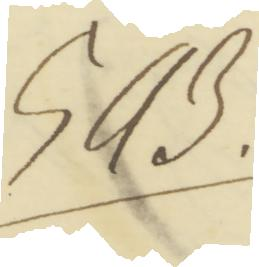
543.
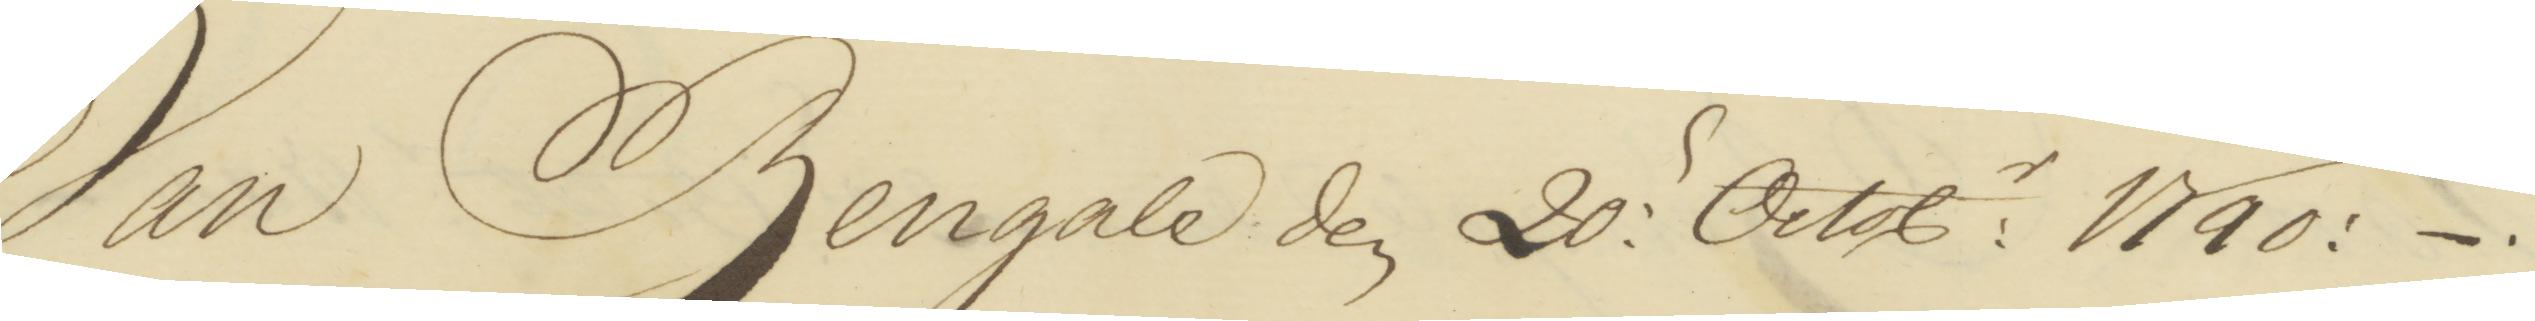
Van Bengale den 20:' Octob:r 1740:-.
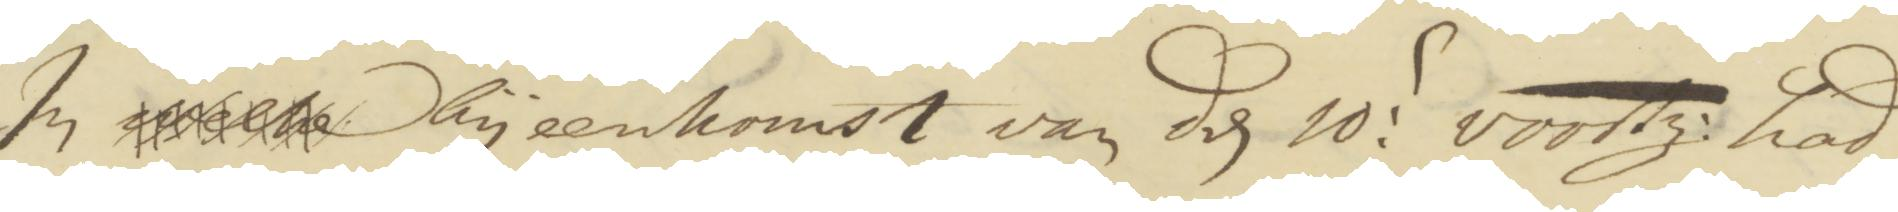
Jn welke bij eenkomst van den 10:' voorsz: had
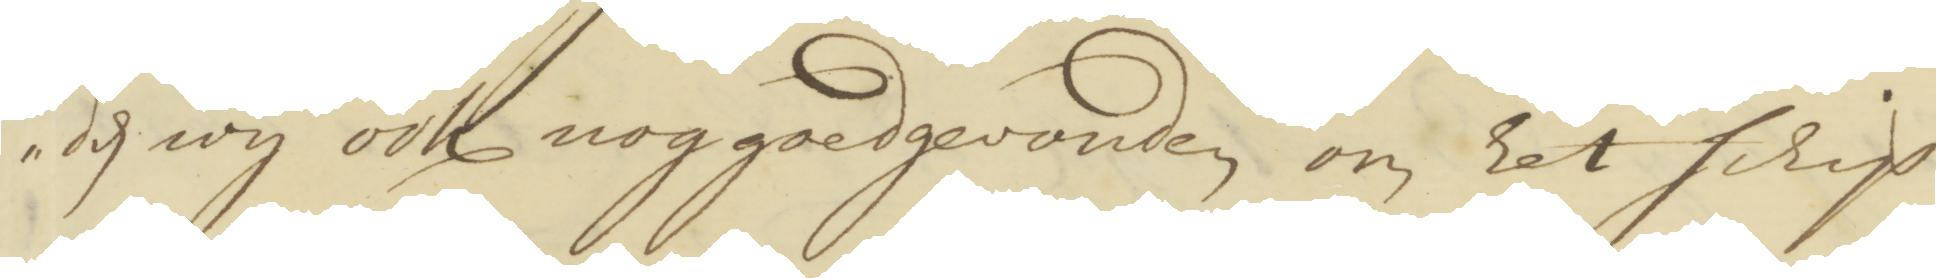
„de wij ook nog goedgevonden om het schip
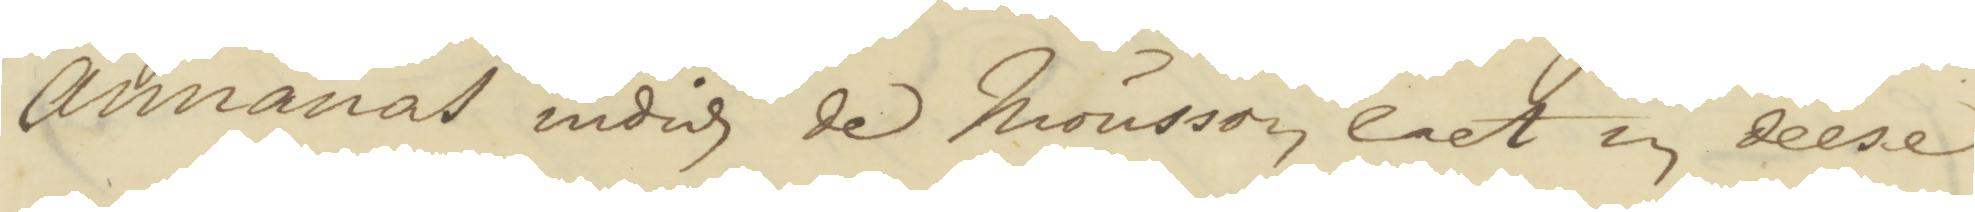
Annanas indien de mousson laet in deese
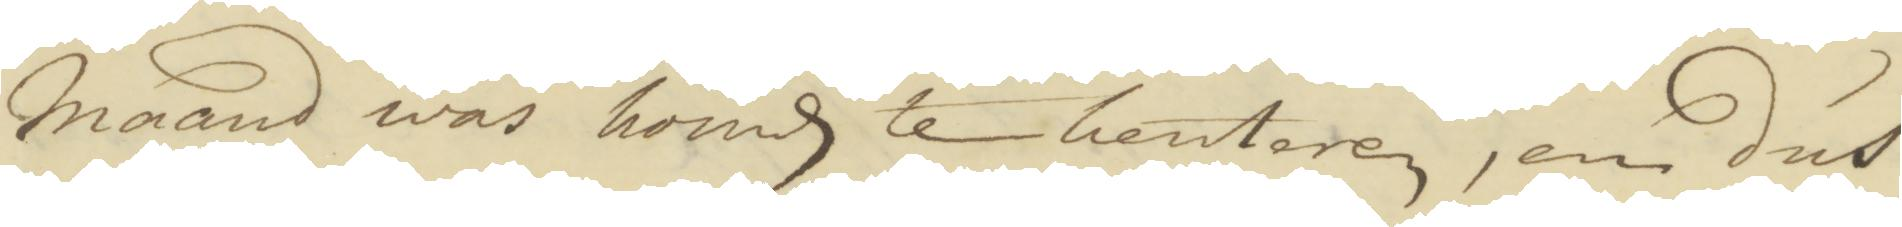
maand was komen te kenteren, en dus
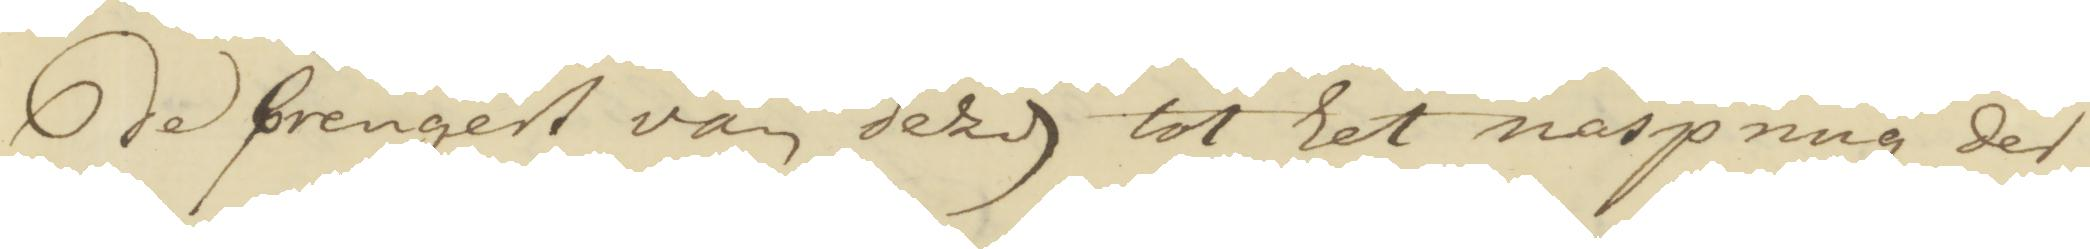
de brengers van dezen tot het naspring der
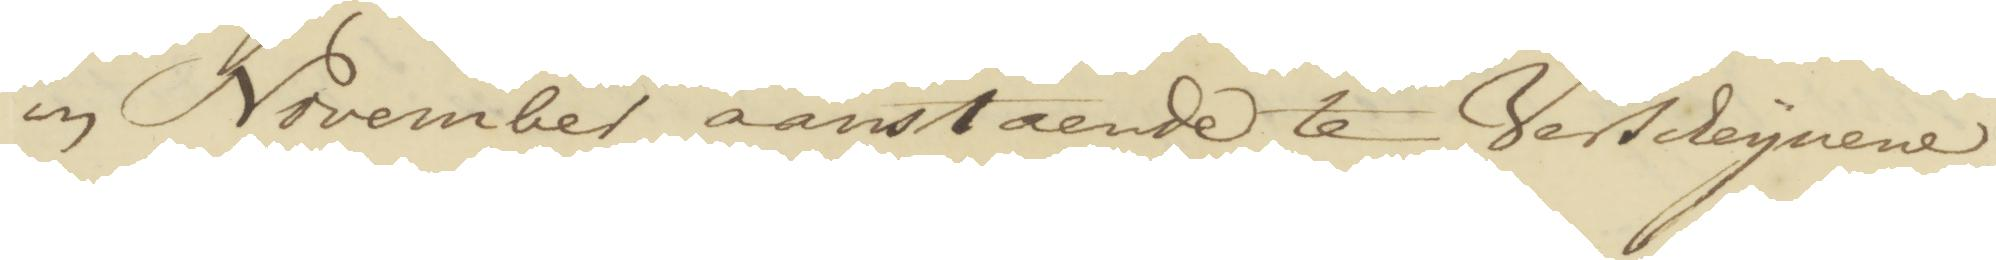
in November aanstaende te Verscheijnene
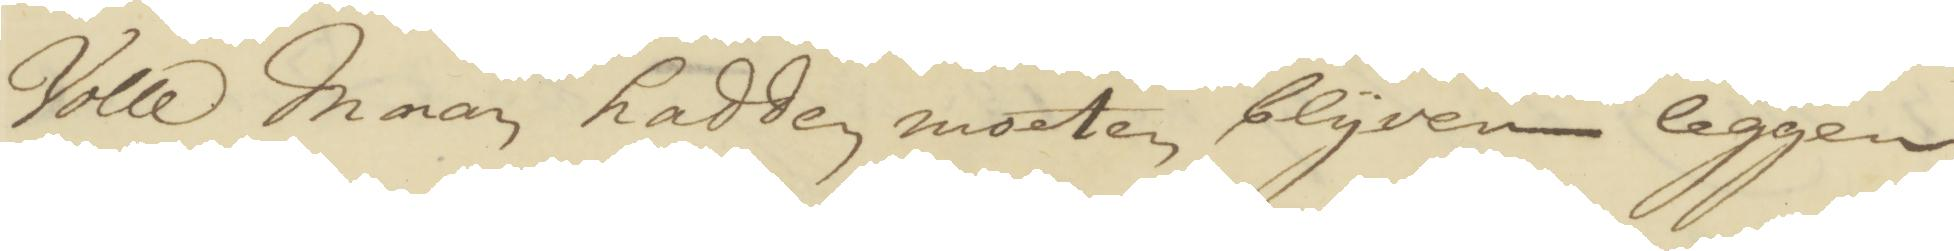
Volle maan hadden moeten blijven leggen,
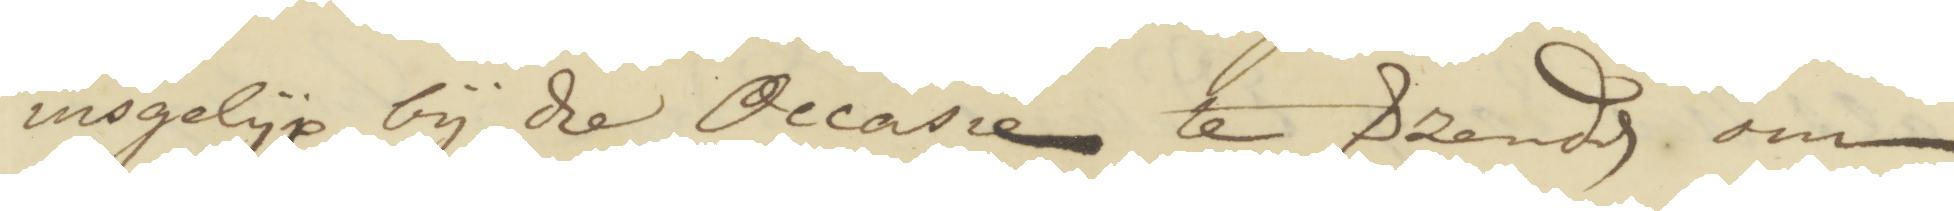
insgelijx bij die Occasie te verzenden om
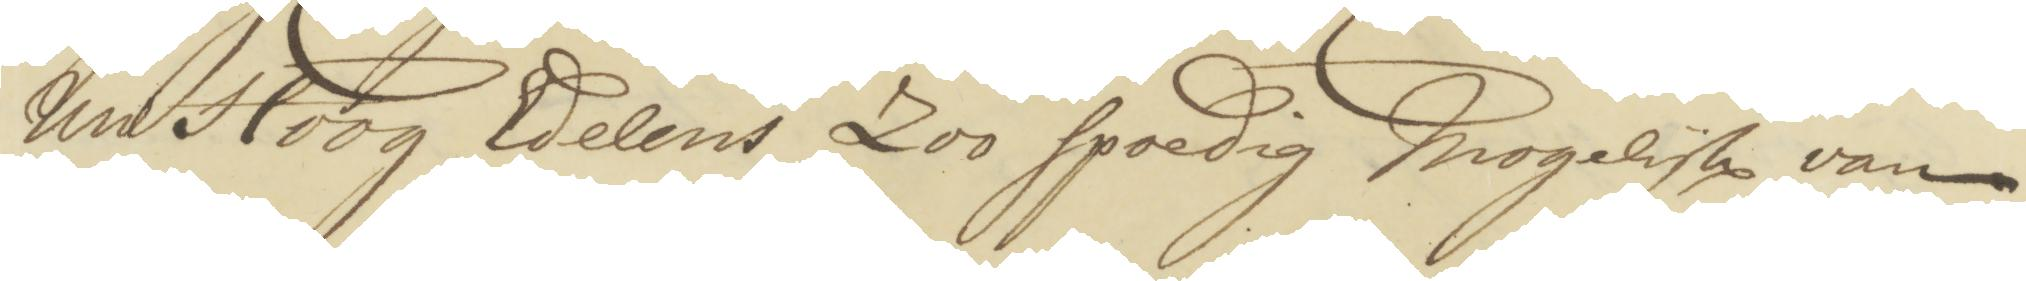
uw Hoog Edelens zoo spoedig mogelijk van
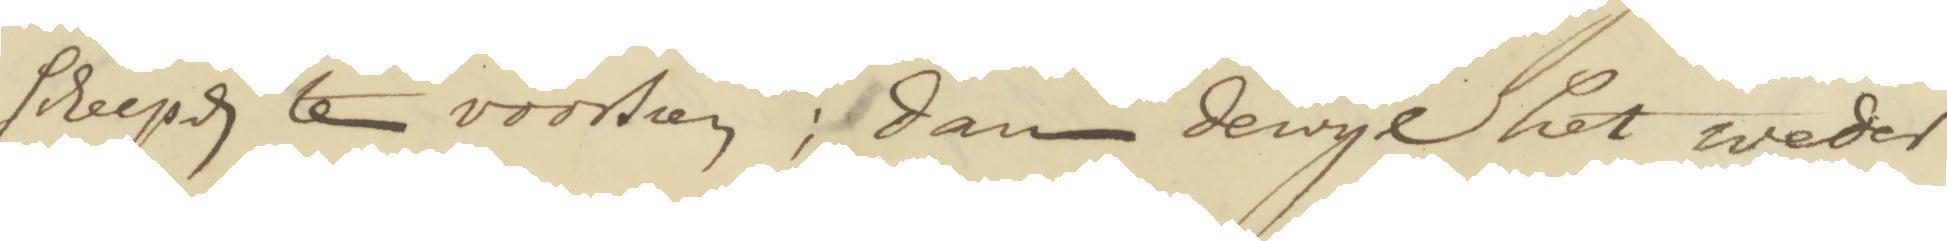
scheepen te voorsien; dan dewijl het weder
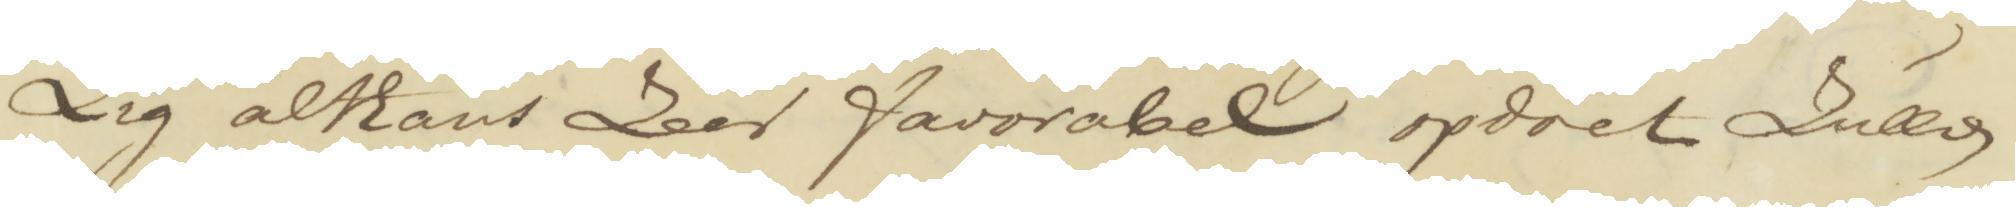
zig althans zeer favorabel opdoet zullen
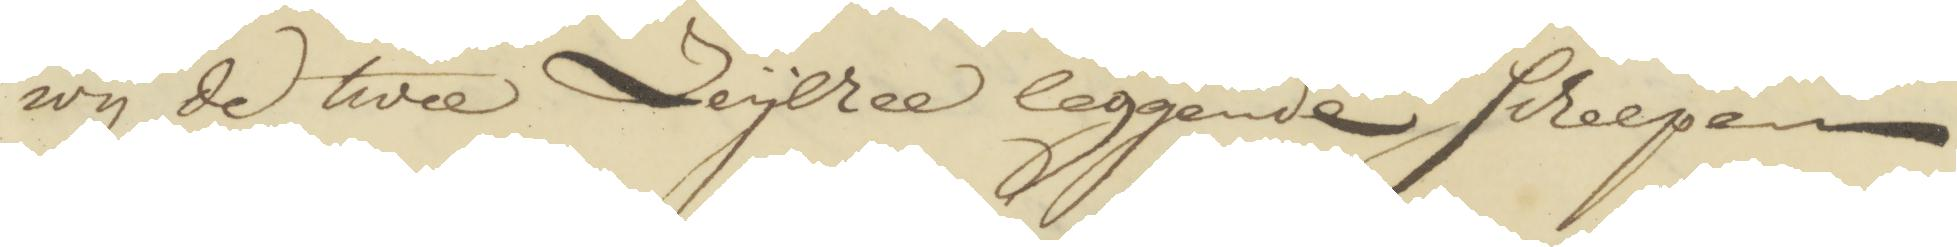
wij de twee Zeijlree leggende scheepen
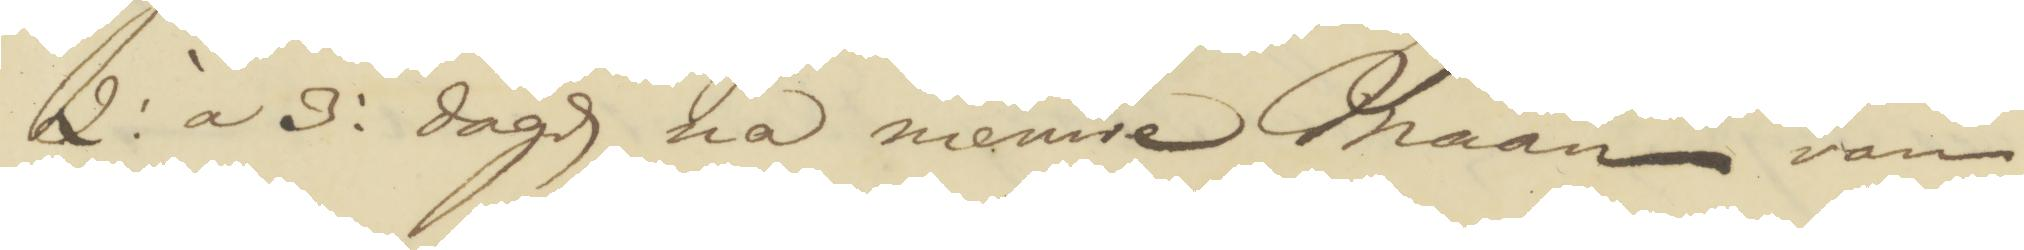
2: à 3: dagen na nieuwe maan van
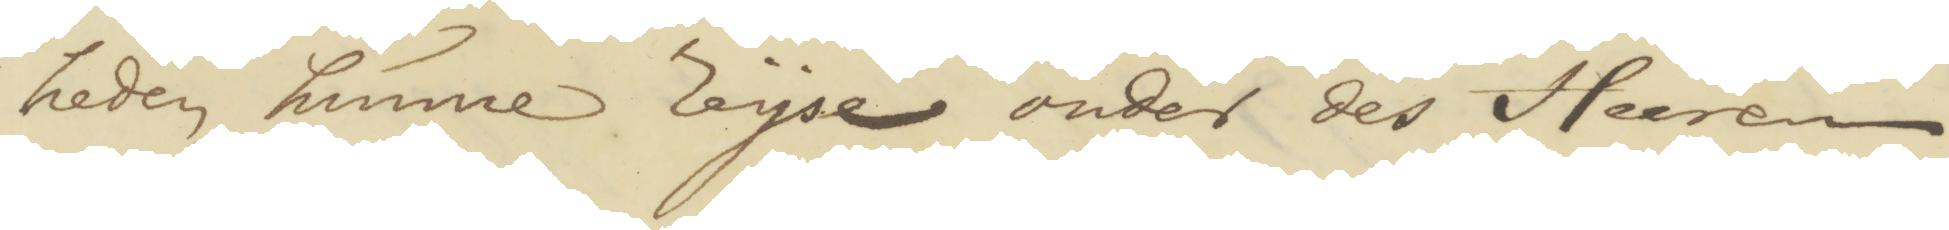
heden hunne reijse onder des Heeren
